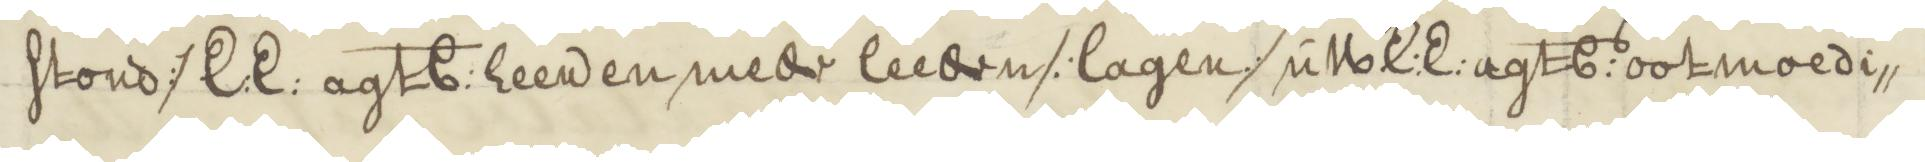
stond:/ E: E: agtb: heer en mede leeden /:lager:/ uw E: E: agtb:s ootmoedi„
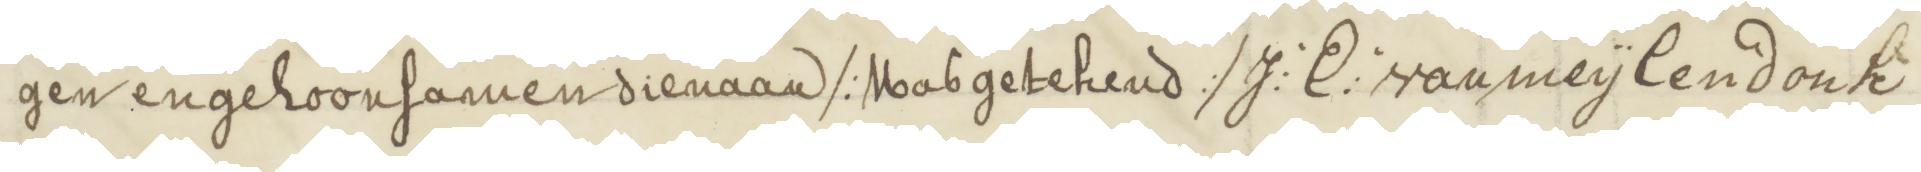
gen en gehoorsamen dienaar /:was getekend:/ J: E: van meijlendonk
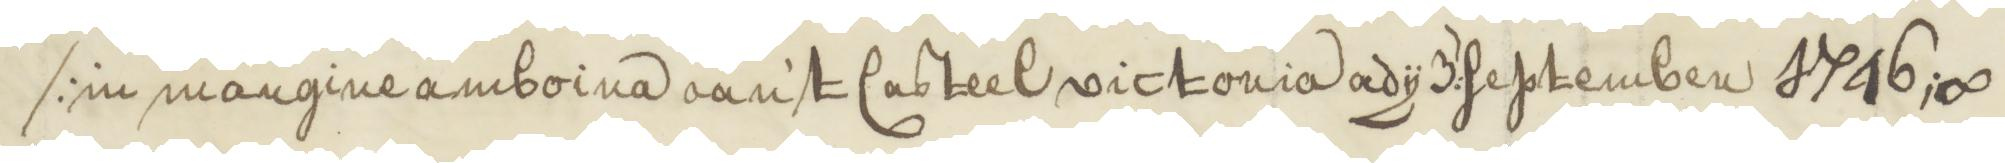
/:in margine amboina aan ’t Casteel victoria adij 3:en september 1746;
